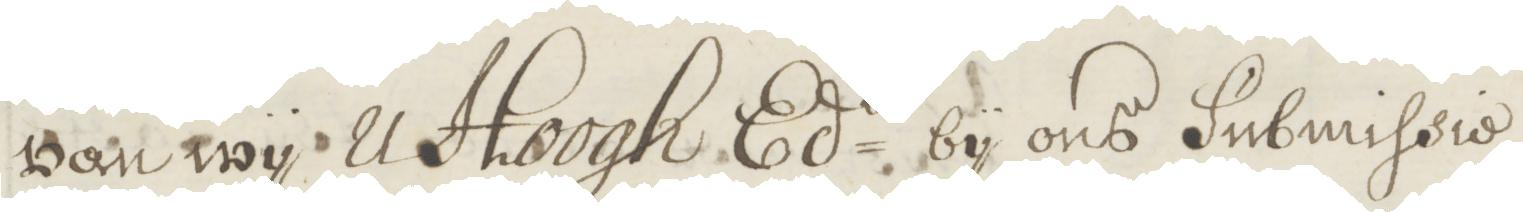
van wij U Hoogh Ed=es bij ons Submissie
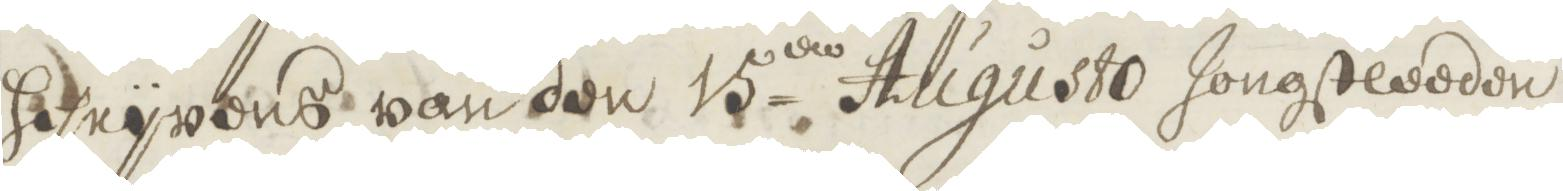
Schrijvens van den 15=en Augusto Jongstleeden
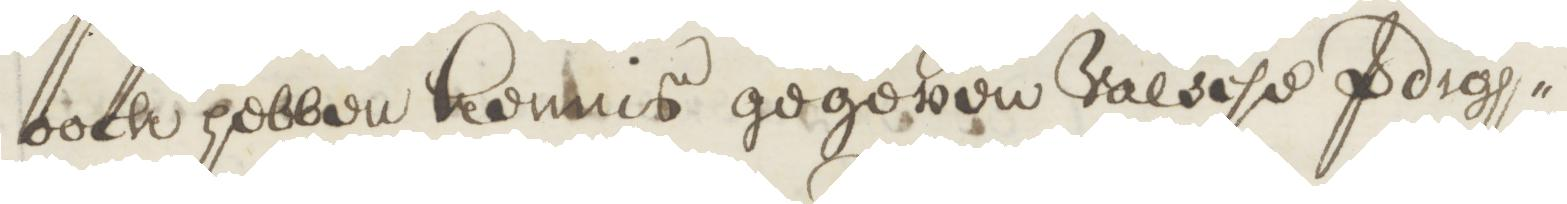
oock hebben kennis gegeven Valsche Verdigh„
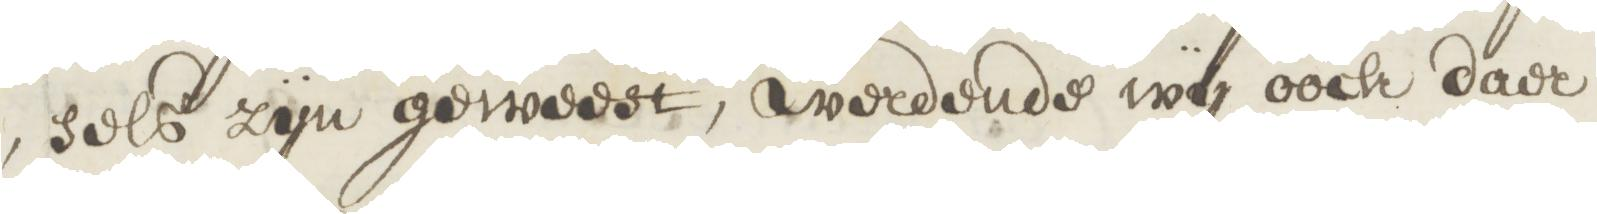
„sels zijn geweest, werdende wij oock daer
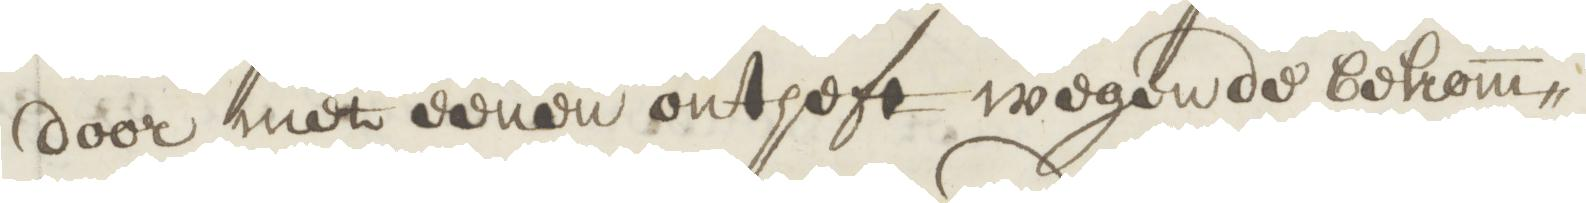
door met eenen ontheft wegen de bekom„
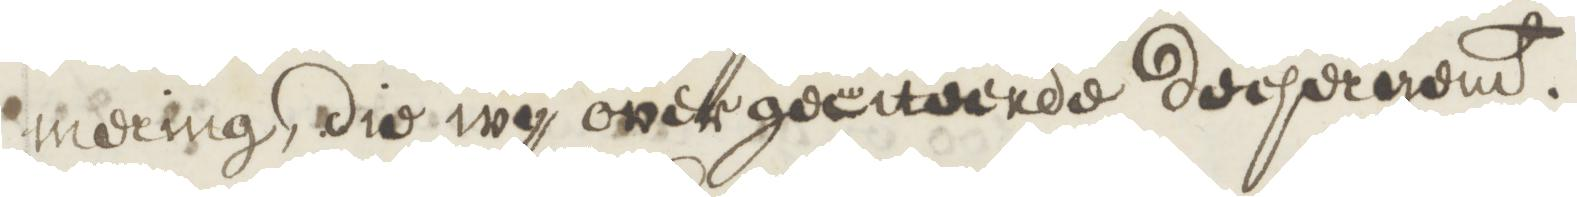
mering, die wij over geciteerde dechergens.
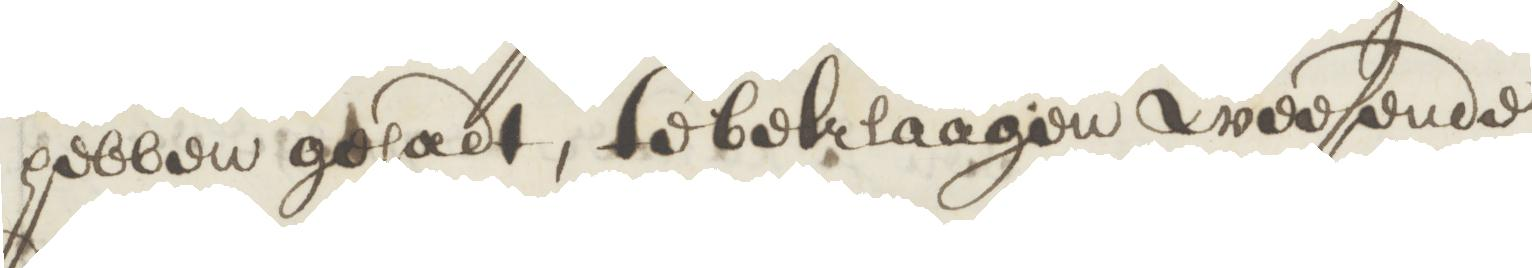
hebben gehadt, te beklaagen weesende
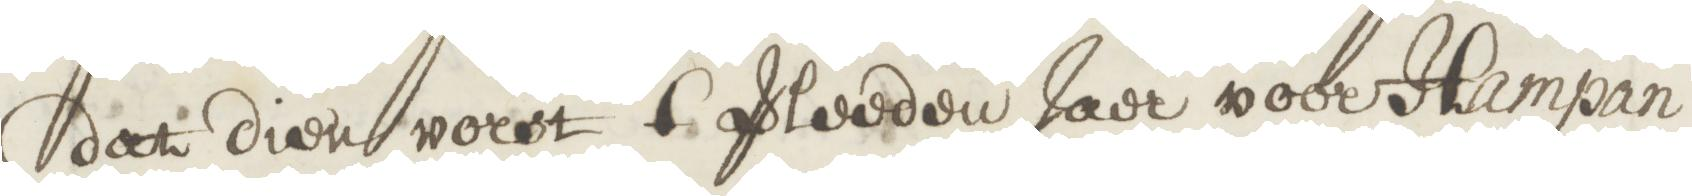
dat dien vorst 't verleeden Jaer voor Hampan
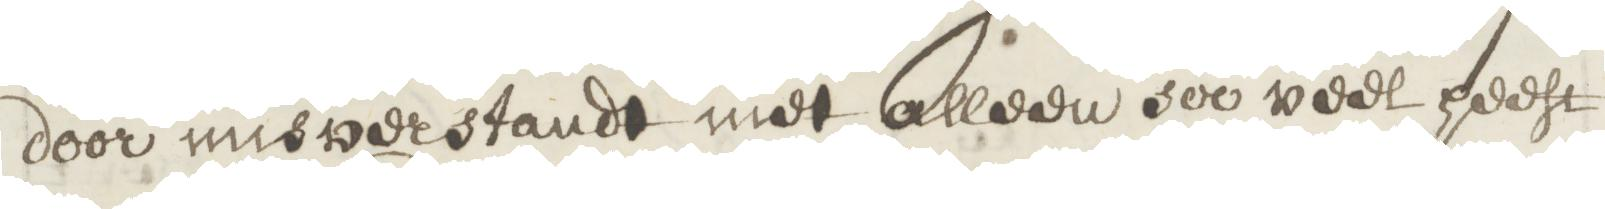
door misverstandt niet alleen soo veel heeft
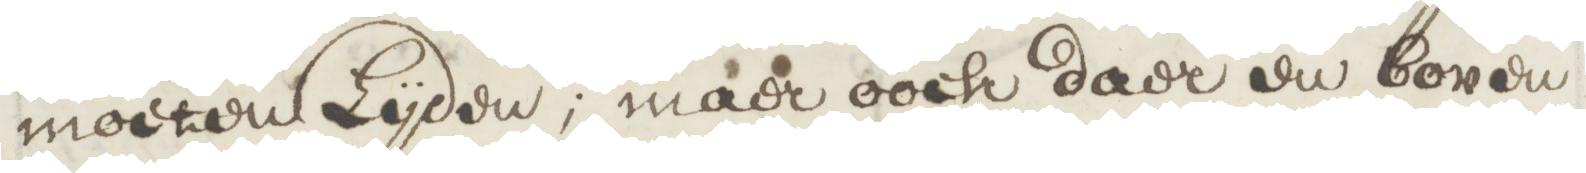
moeten Lijden; maer oock daer en boven
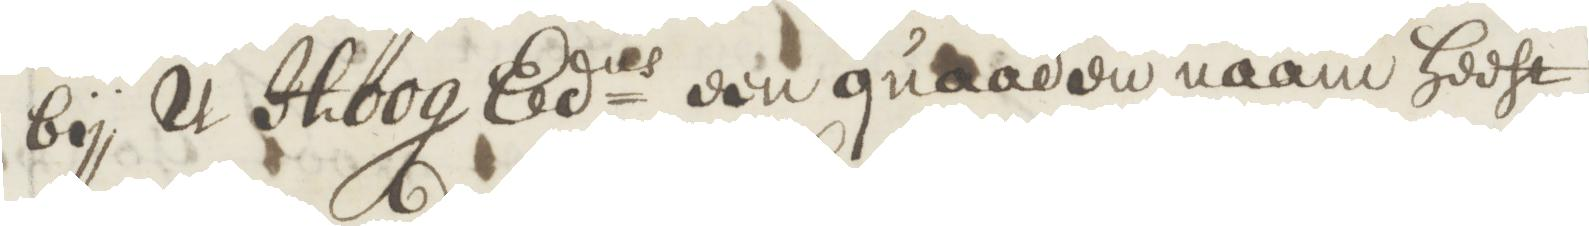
bij U Hoog Ed=ns een quaaden naam heeft
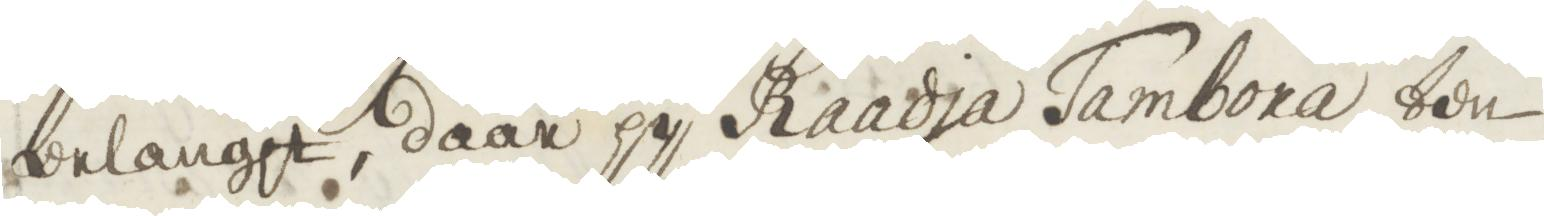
verlanght, daar hij Raadja Tambora ten
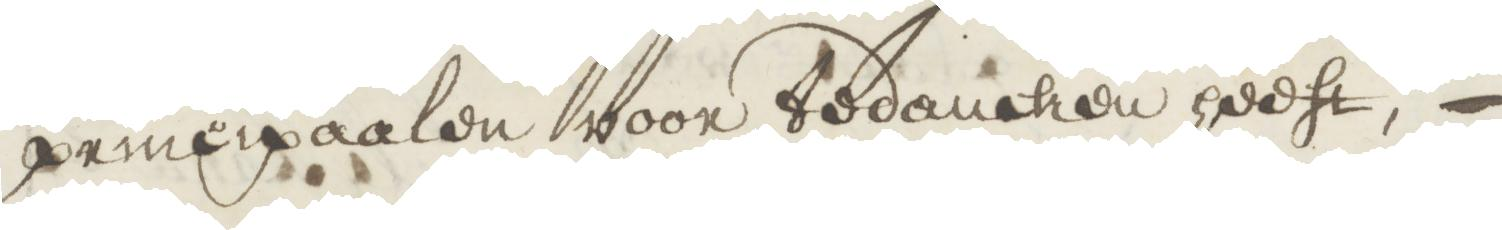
principaalen voor te dancken heeft; —
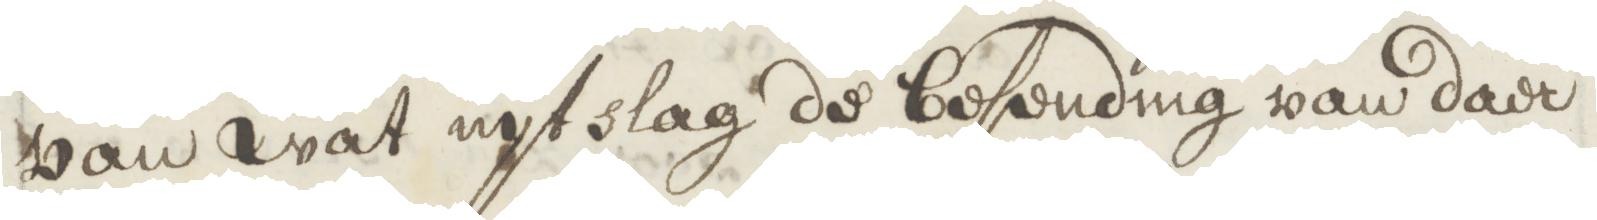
van wat uijtslag de besending van daer
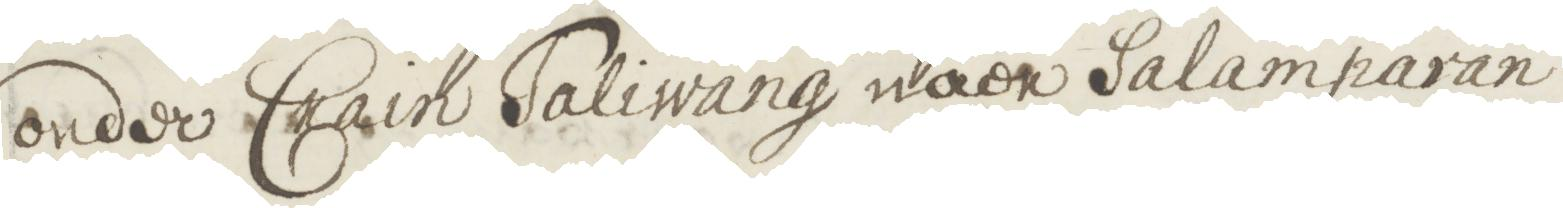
onder Crain Taliwang waer Salamparan
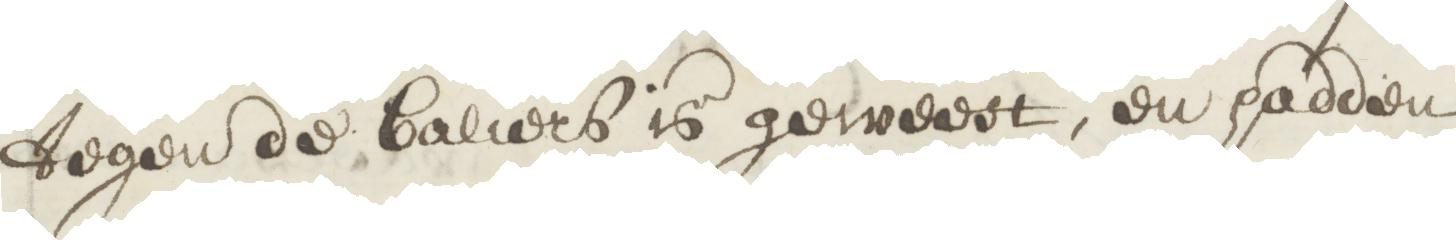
tegen de baliers is geweest, en hadden
